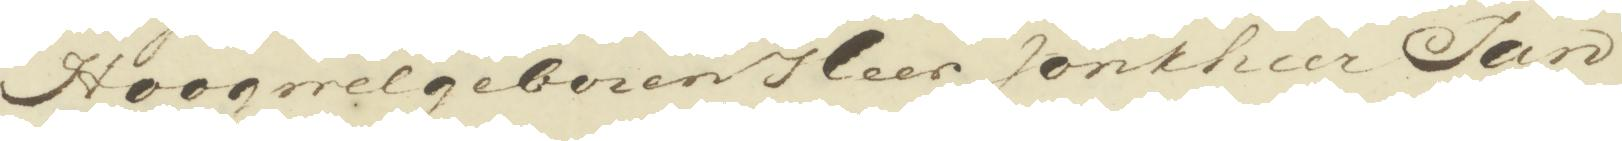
Hoogwelgeboren Heer Jonkheer Ian
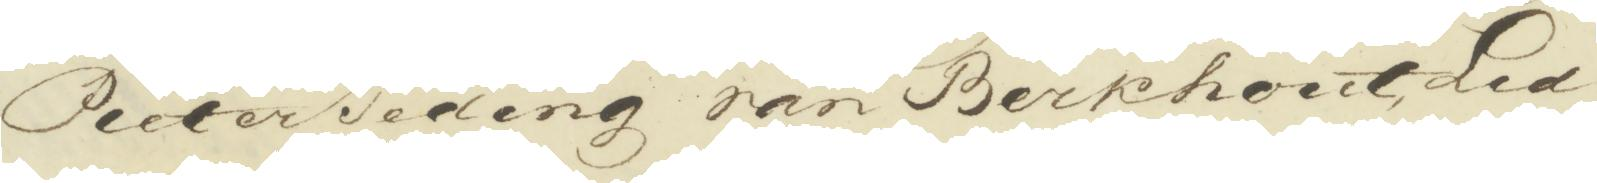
Pieter Teding van Berkhout, Lid
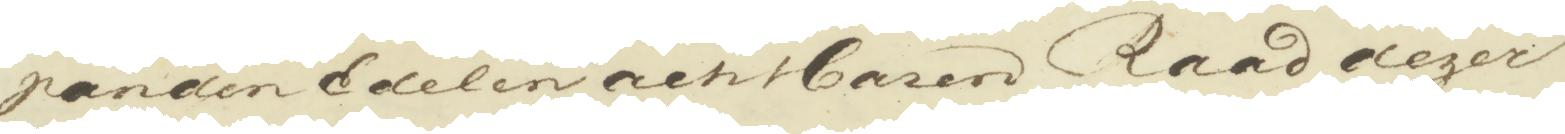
van den Edelen achtbaren Raad dezer
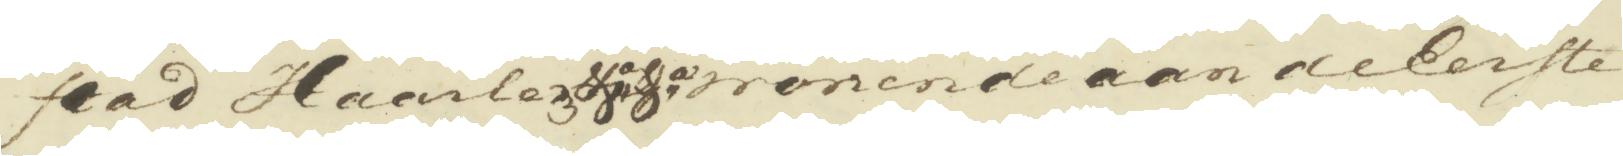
stad Haarlem W wonende aan de Eerste
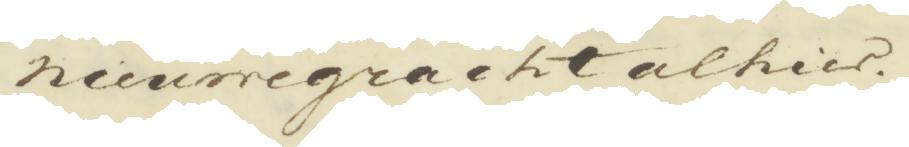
nieuwegracht alhier.
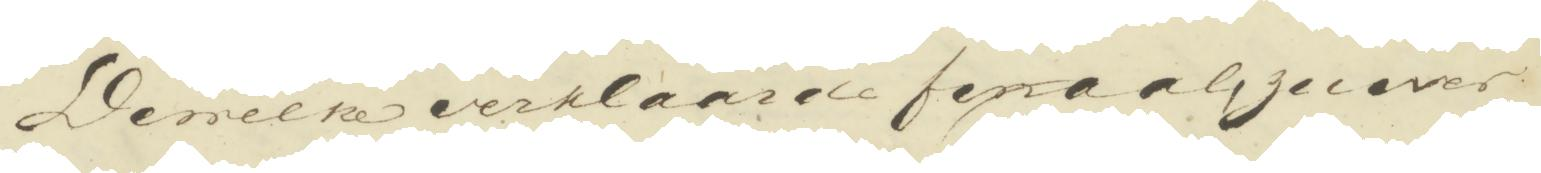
Dewelke verklaarde finaal zuiver
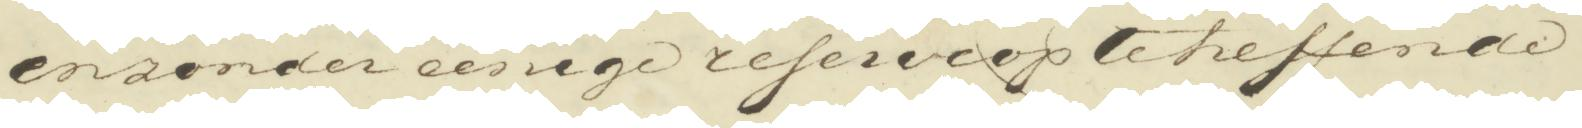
enzonder eenige reserve op te heffen de
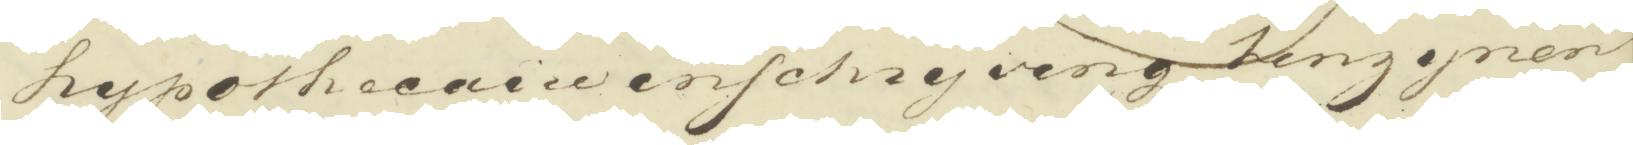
hypothecaire inschryving ten zynen
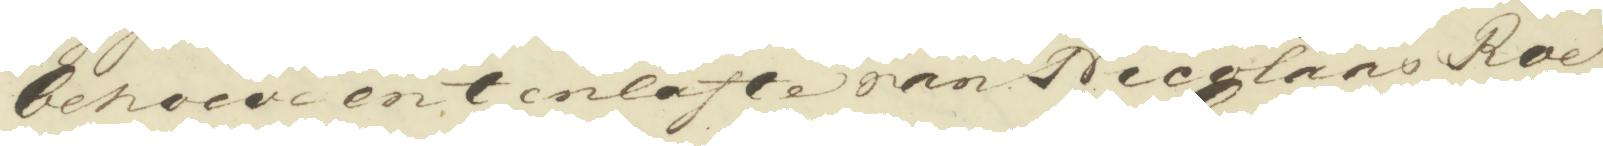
behoeve en tenlaste van Nicolaas Roe
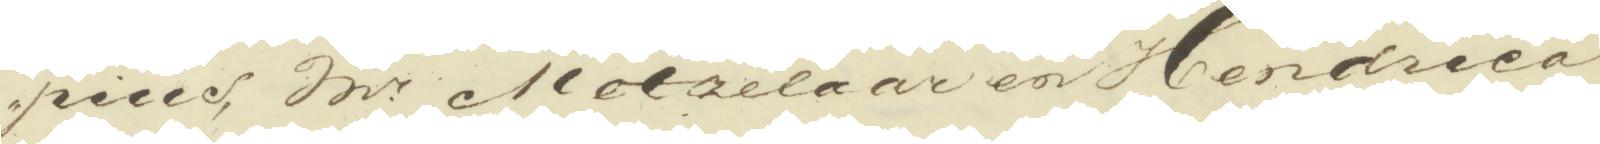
„pius, M:r Metzelaar en Hendrica
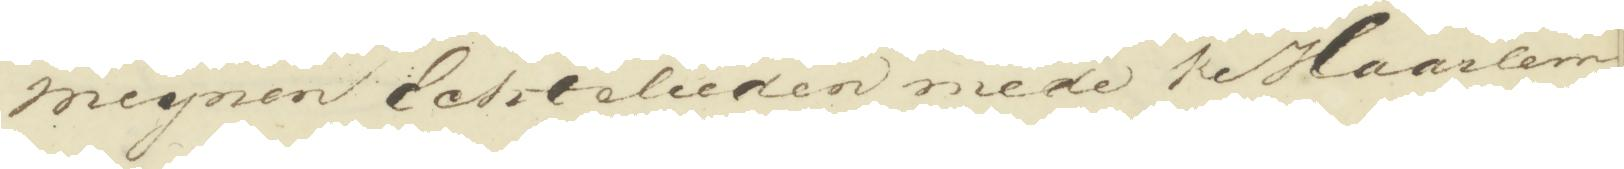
meynen Echtelieden mede te Haarlem
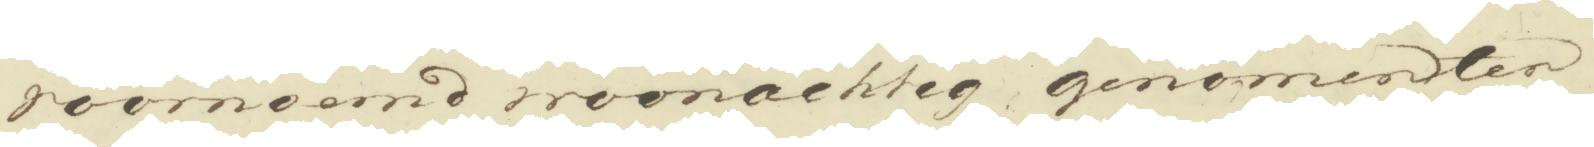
voornoemd woonachtig, genomen ten
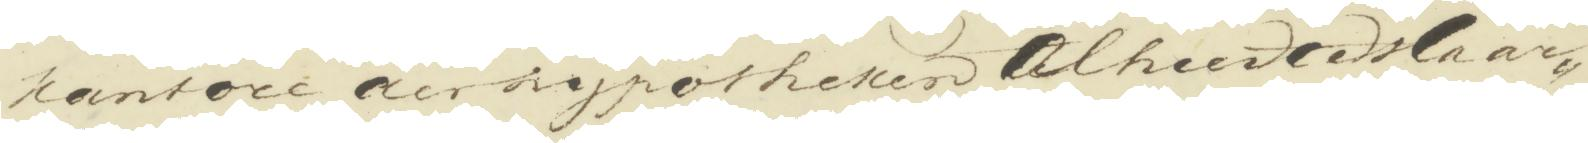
kantore der hypotheken Alhier te Haar„
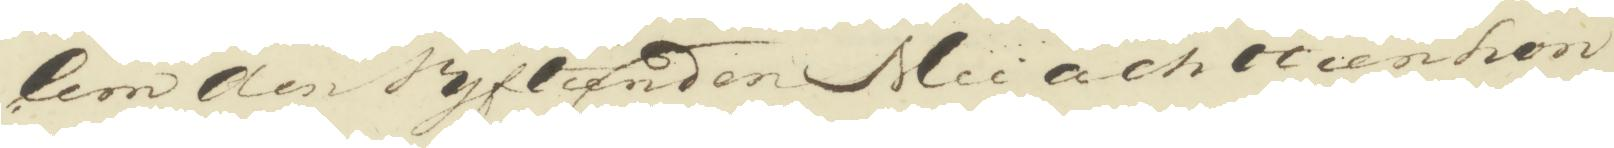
lem den Vyftienden Mei achttienhon
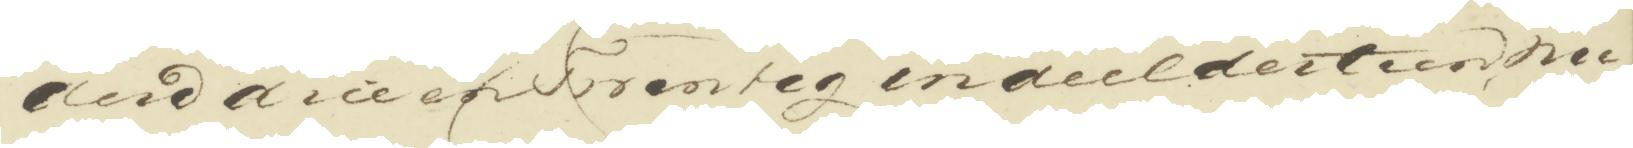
= derd drie en Twintig in deel dertien nu
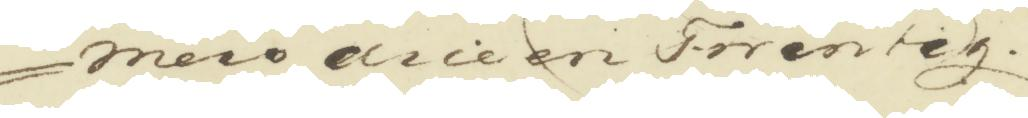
=mero drie en Twintig.
